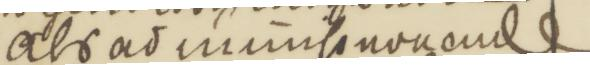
als administrerende
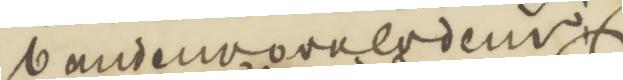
van den overledene
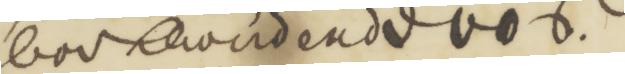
boekhouder de vos.
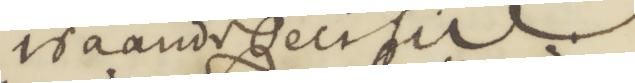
is aan de decisie
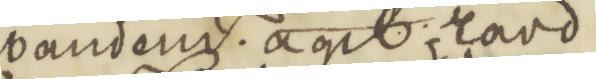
van den E. agtb: raed
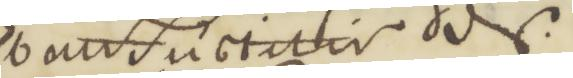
van Justitie des
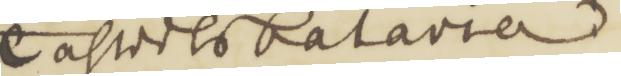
Casteel batavia
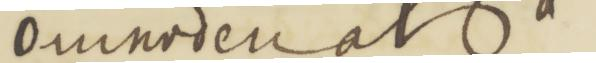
om reden als
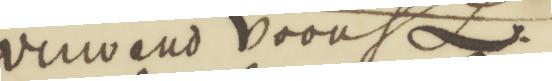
vruwerd voorsz:
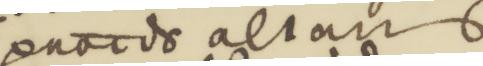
proces altans
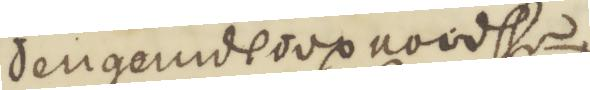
den gemelde processe,
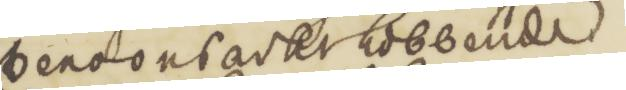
veroorsaekt hebbende
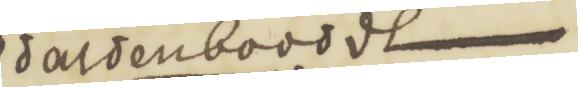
dat den boedel
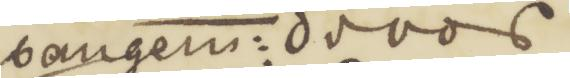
van gem: de vos
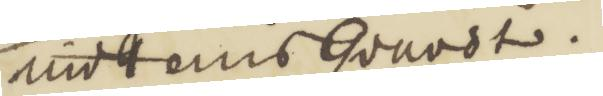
niet en is gerust.
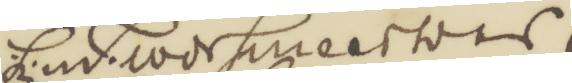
sijn E. weesmeesters
